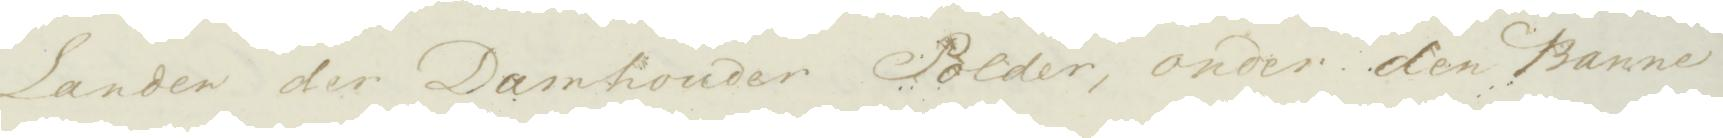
Landen der Damhouder Polder, onder den Banne
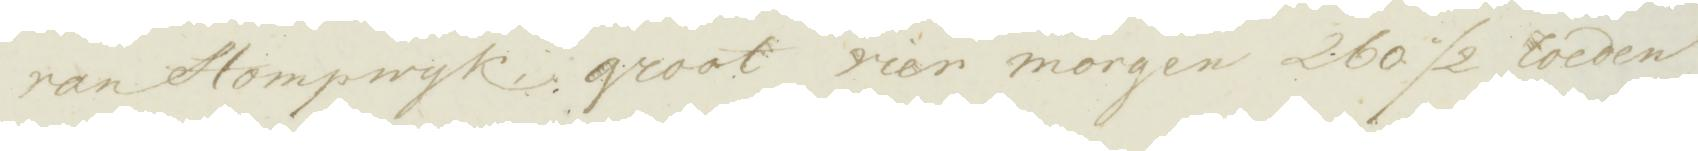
van Hompwijk groot vier morgen 260½ roeden
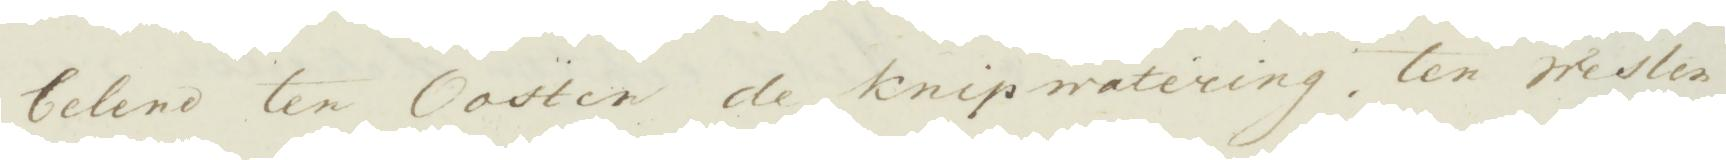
belend ten Oosten de knipwatering, ten westen
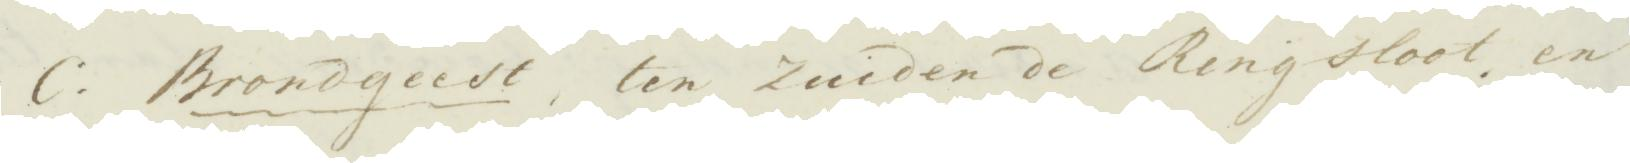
C. Brondgeest, ten zuiden de Rengsloot, en
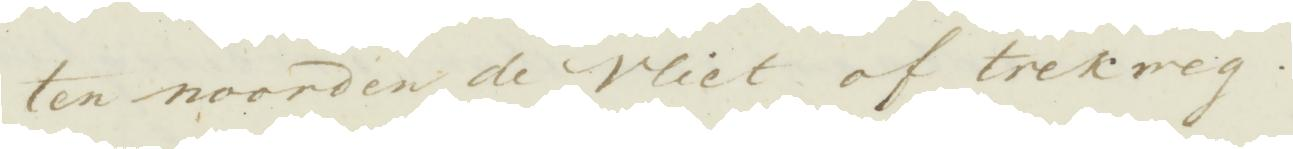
ten noorden de vliet of trekweg.
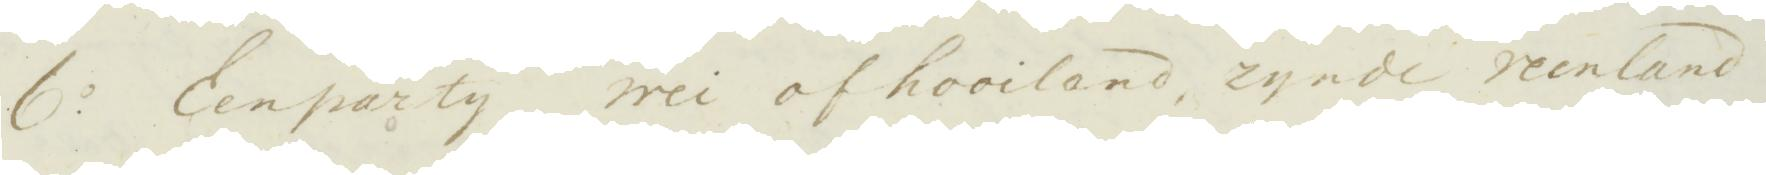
6: Een party wei of hooiland, zynde veerland
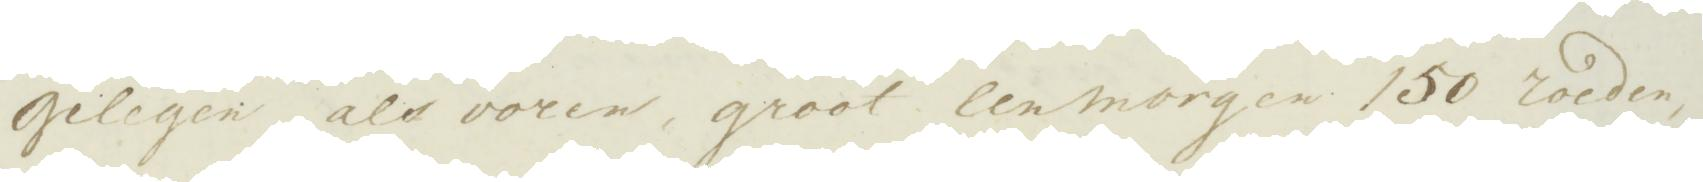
gelegen als voren, groot een morgen: 150 roeden,
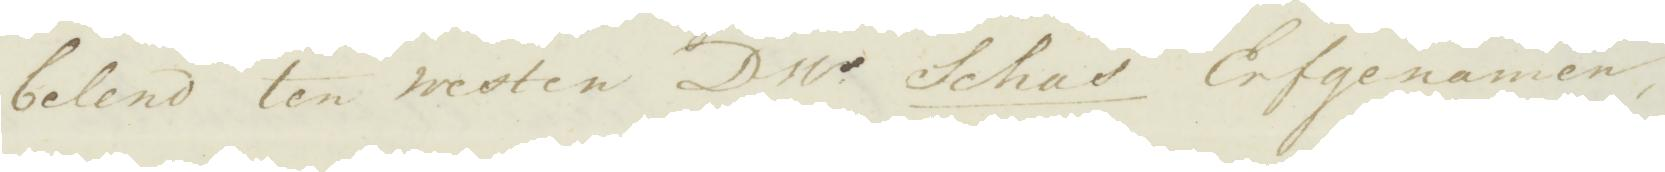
belend ten westen DW.s Schas Erfgenamen,
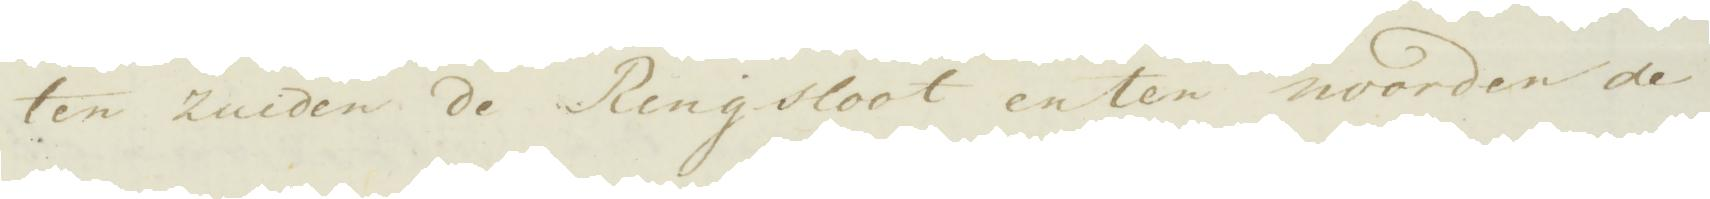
ten zuiden de Rengsloot en ten noorden de
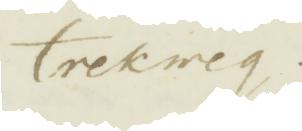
trekweg.
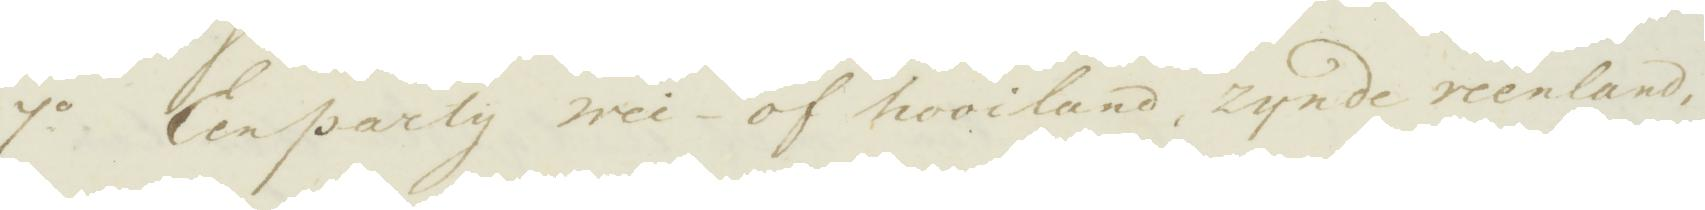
7.o Een partij wei- of hooiland, zynde veenland,
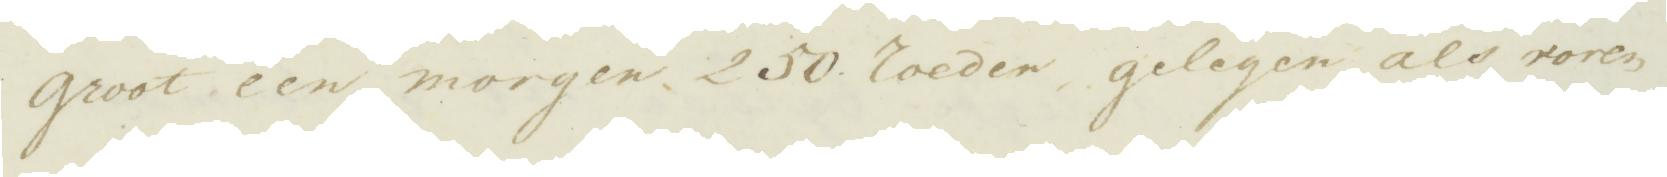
groot, een morgen 250. roeder, gelegen als voren
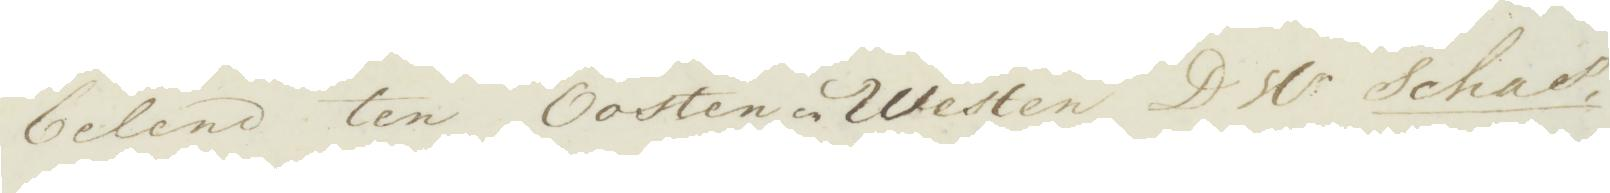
belend ten Oosten en Westen D H:r Schas„
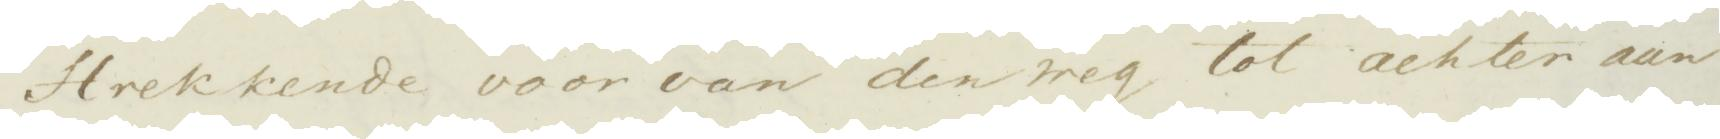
strekkende voor van den weg tot achter aan
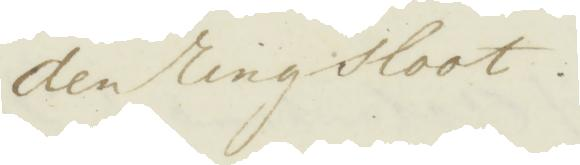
den ringsloot.
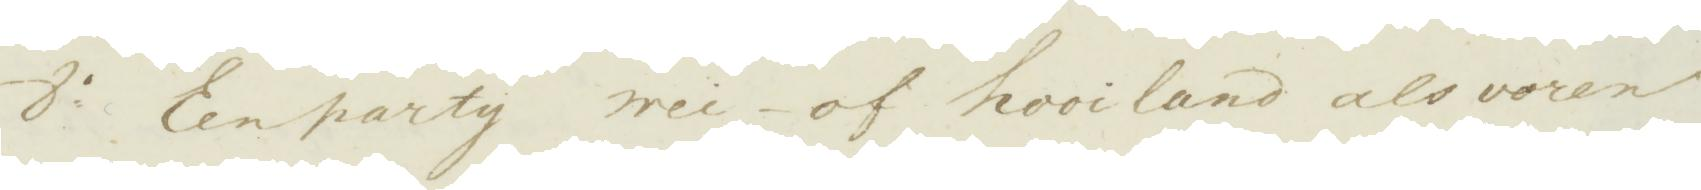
8:o Een partij wei- of hooiland als voren
